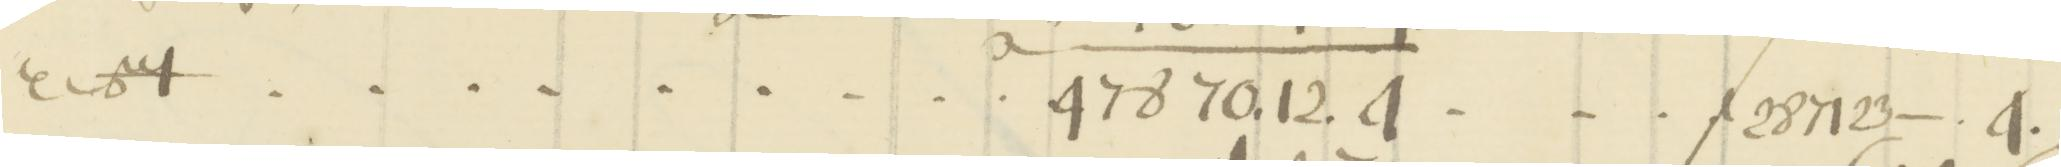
rest - - - - - - - - - 47870.12. 4 - - - ƒ 287123—. 4.
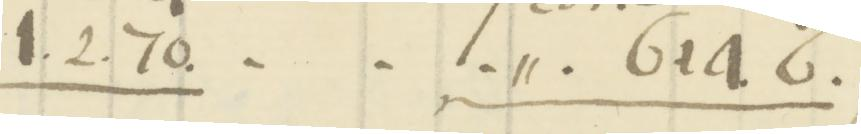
1:2.70. - - - „. 614. 6.
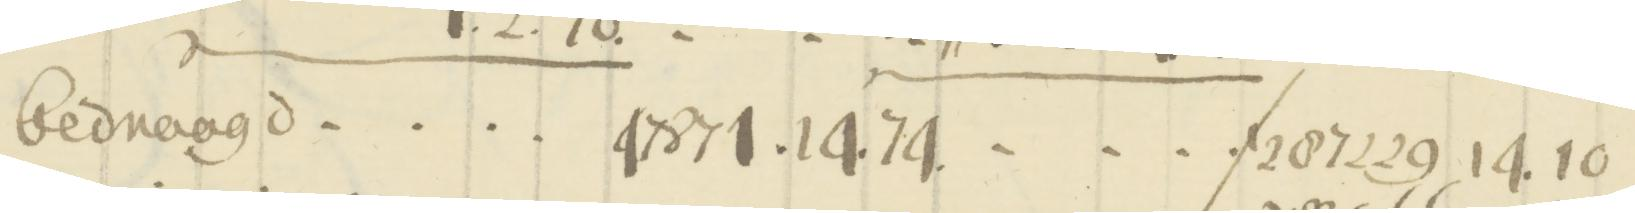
bedraagd - - - - 47871.14.74 - - -ƒ287229 14. 10
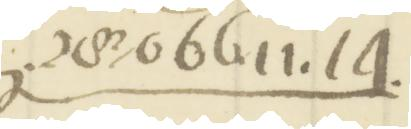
.282066.11.14.
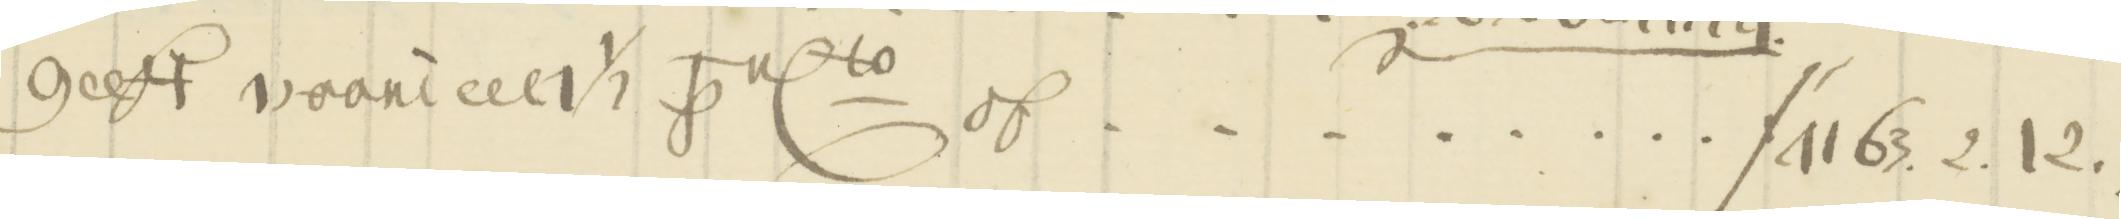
geeft voordeel 1 ½ prct_o of - - - - - - - -ƒ4163.2.12.
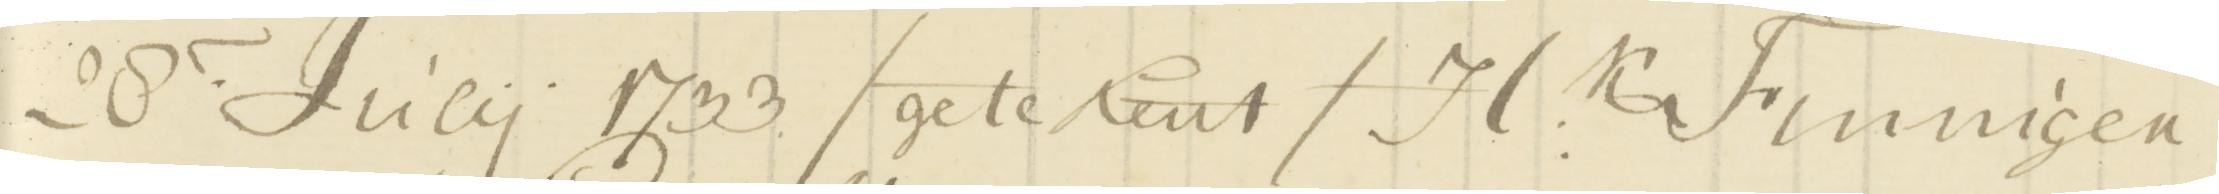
28:' Julij 1733 /getekent/ H:k Finniger
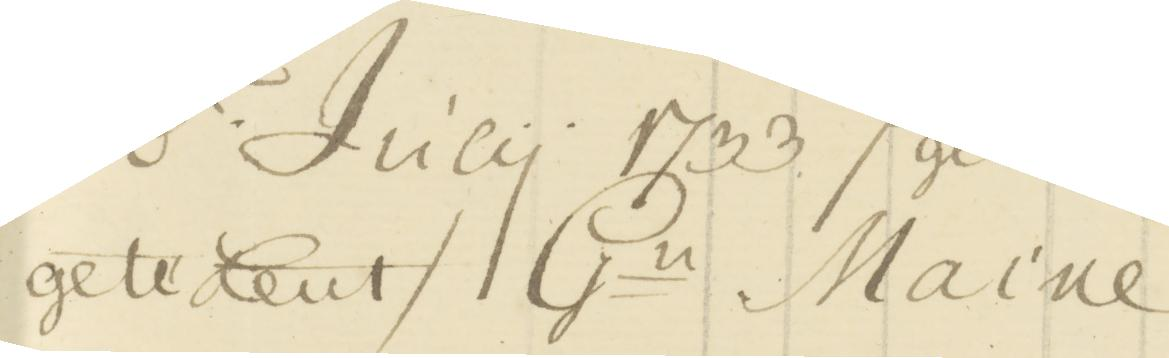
getekent/ G=n Maire
